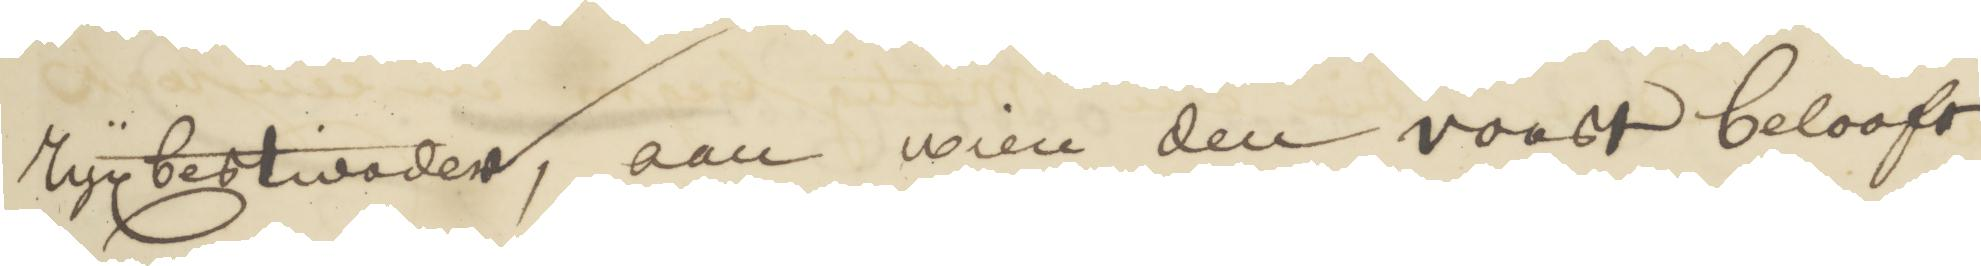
rijxbestierder, aan wien den vorst belooft
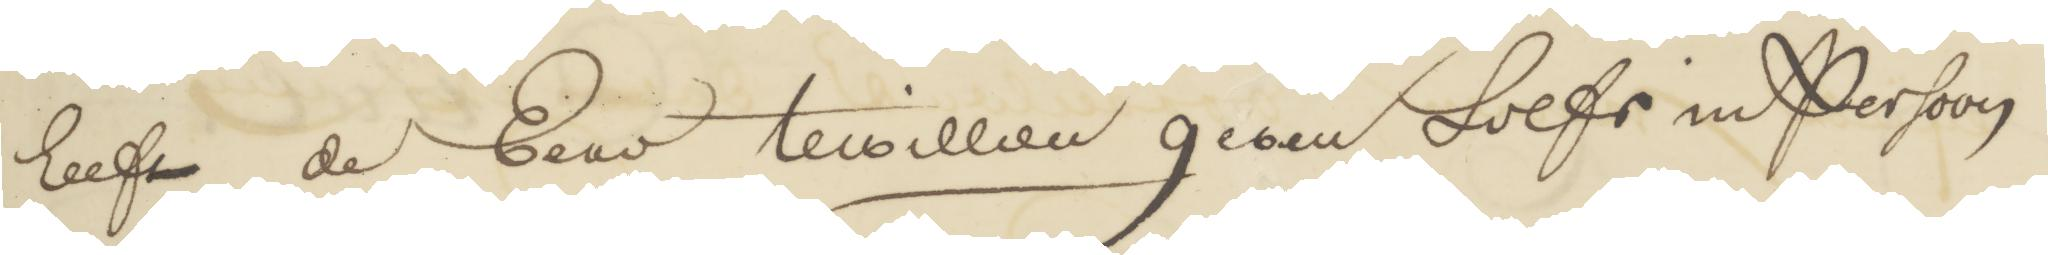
heeft de Eere tewillen geven Selfs inPersoon
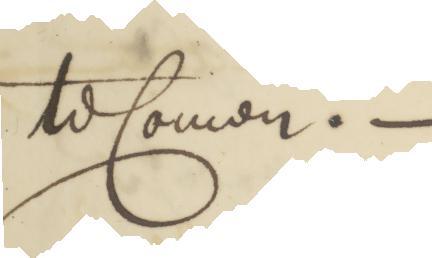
te Comen. —
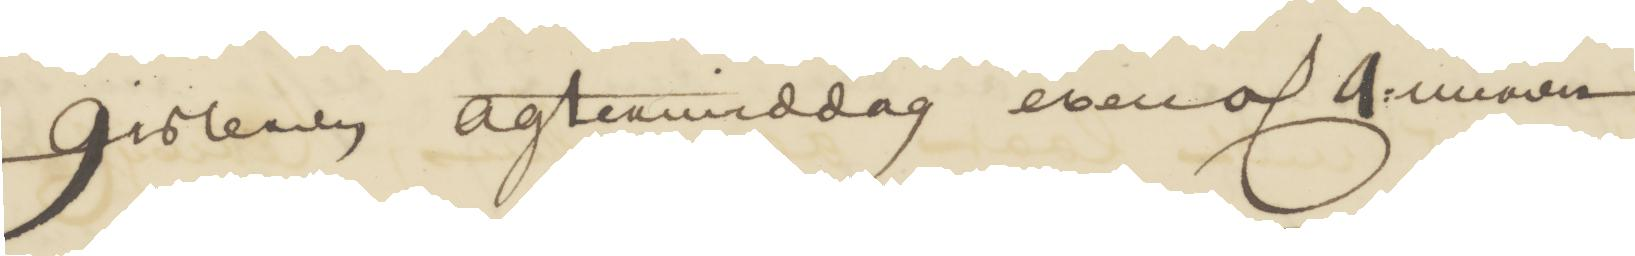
gisteren agtermiddag evenover 4: uuren
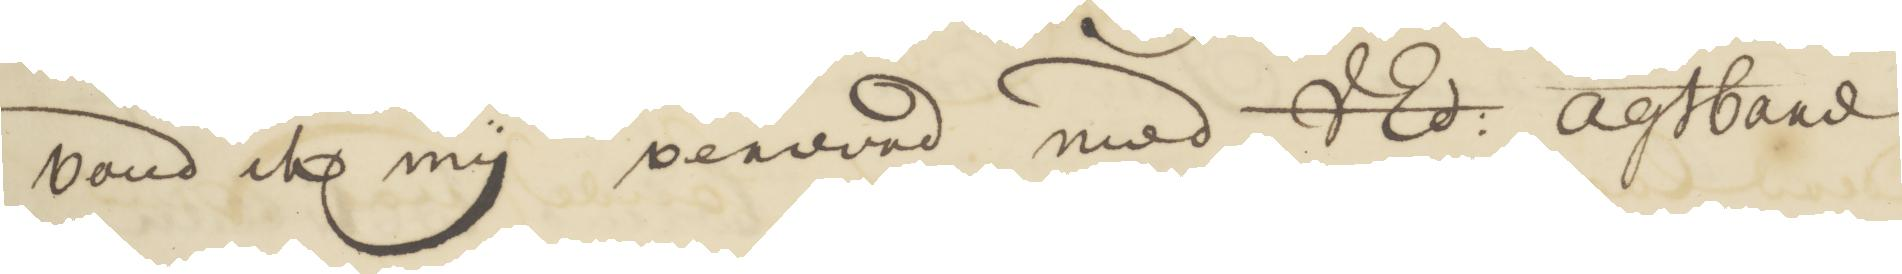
vond ik mij vereerd med VEd: agtbare
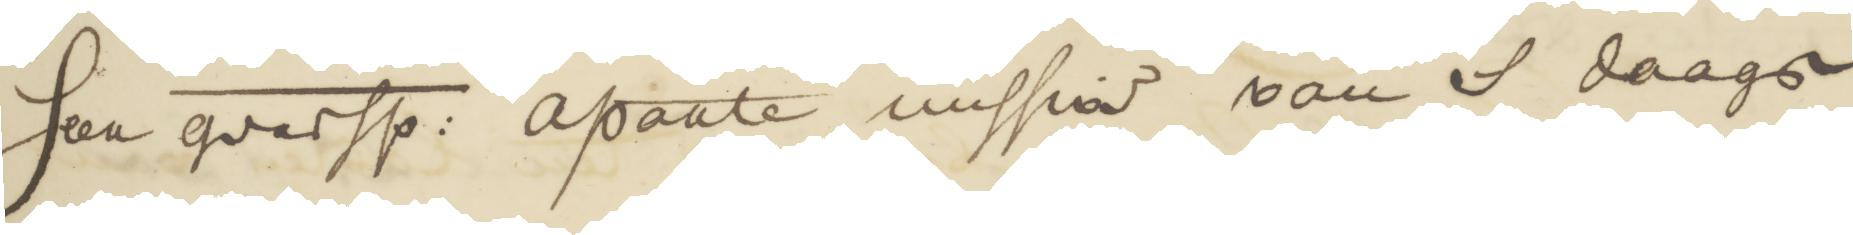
seer geresp: aparte missive van 's daags
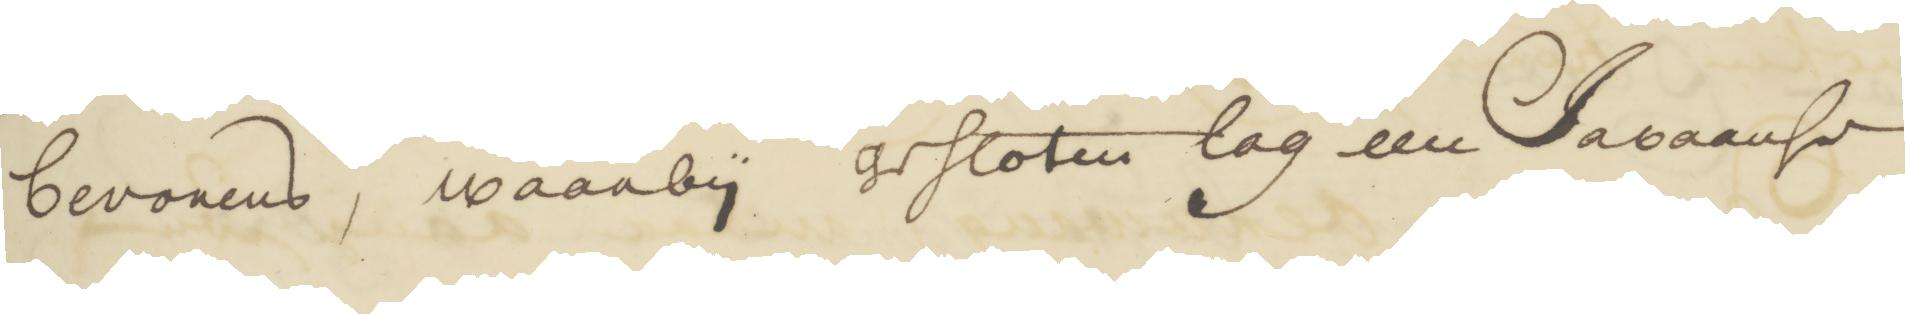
bevorens, waarbij gesloten lag een Iavaanse
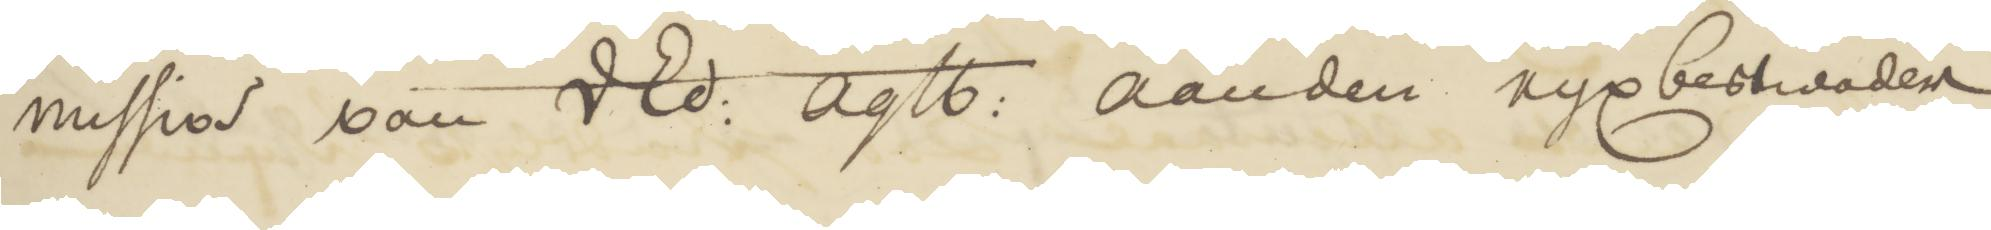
missive van VEd: agtb: aanden rijxbestierder
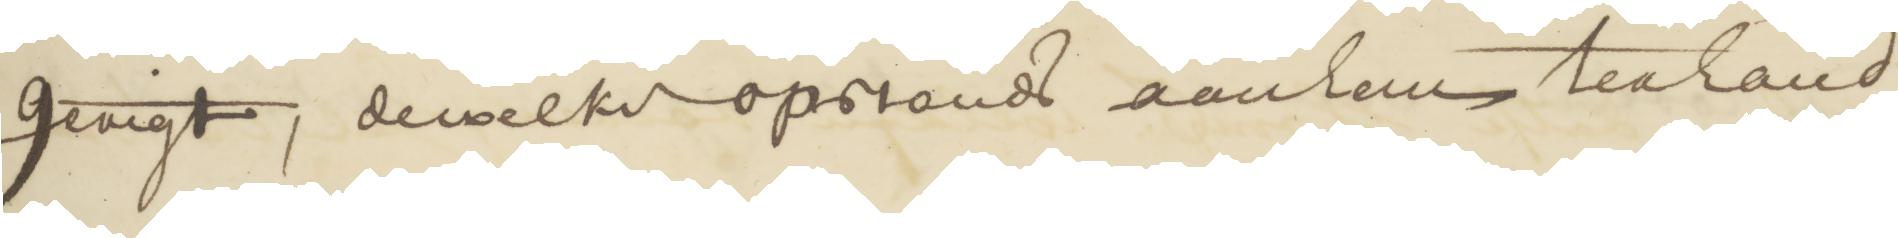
gerigt, dewelke opstonds aanhem terhand
